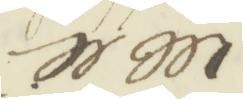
W W
